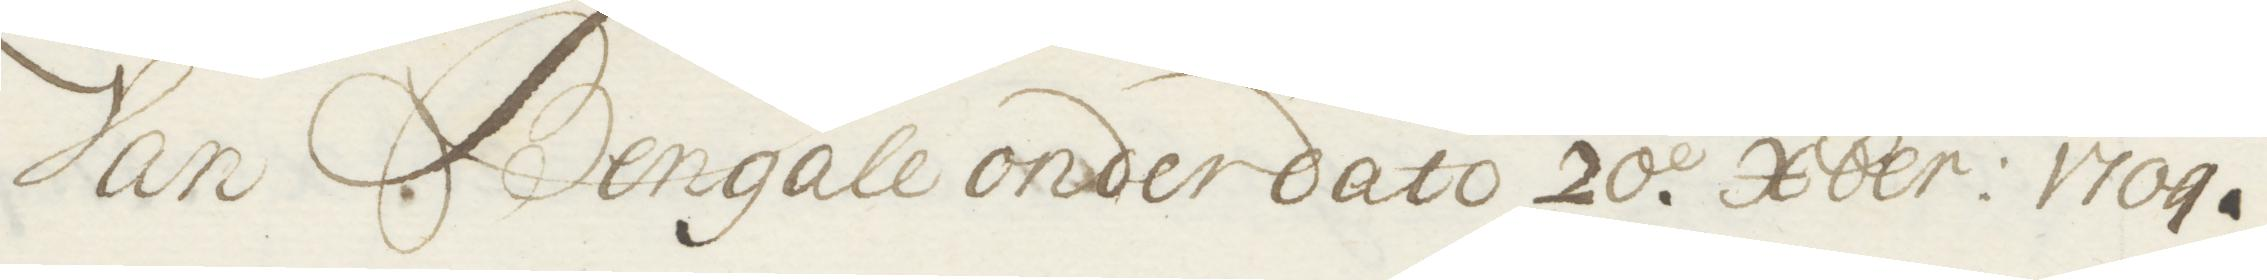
Van Bengale onder dato 20.e xber: 1704.
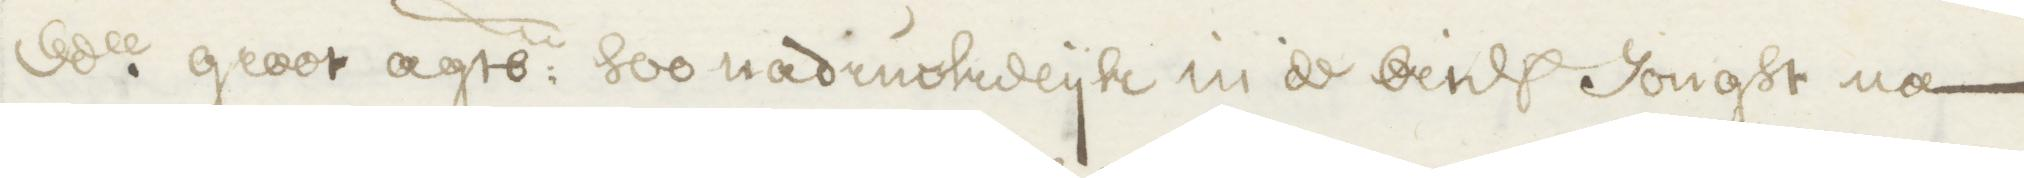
Ed.le groot agtb: soo nadruckelijk in de brief Iongst na
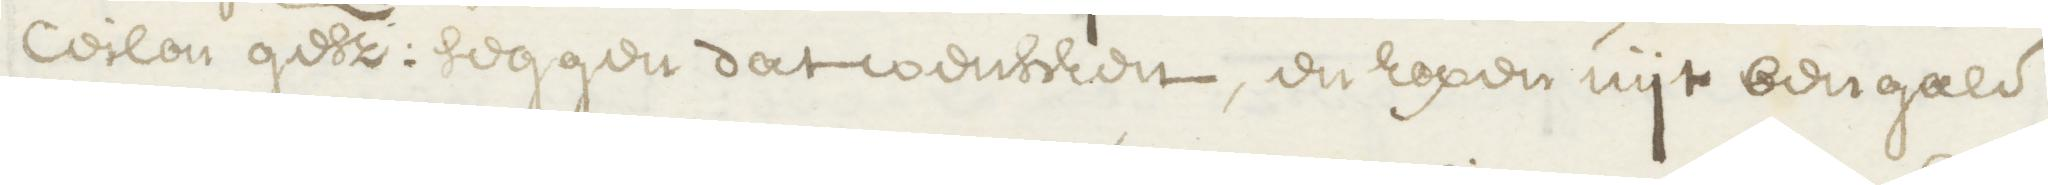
Ceilon gesz: seggen dat wenschen, en hopen uijt bengale
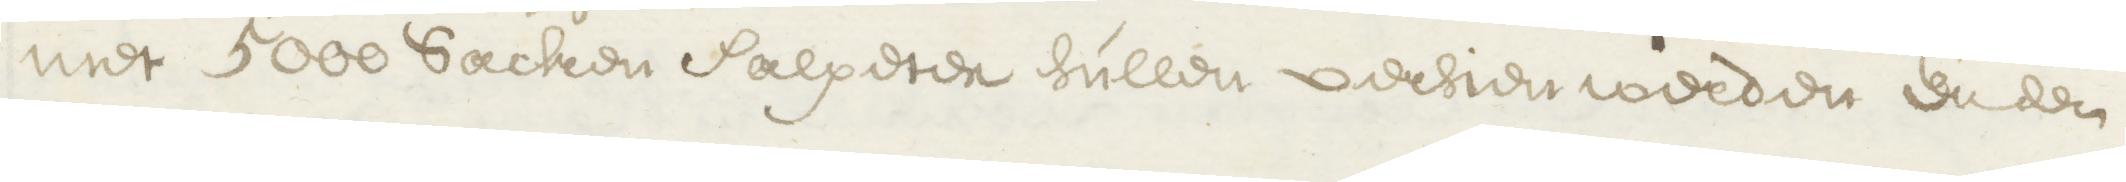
met 5000 sacken salpeter sullen versien werden En den
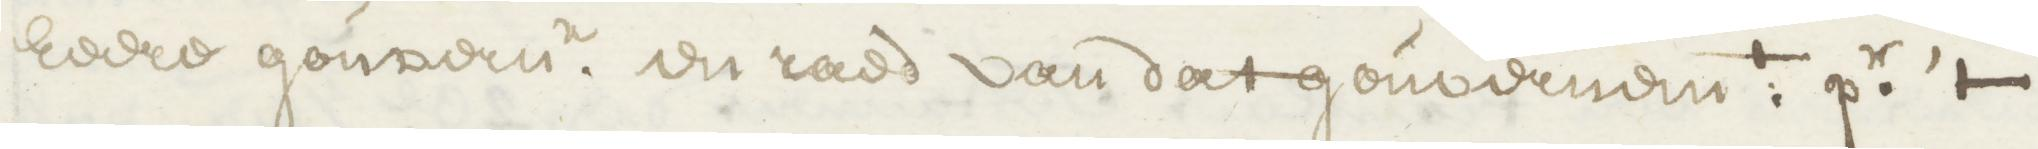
heere gouvern.r en raed van dat gouvernem:t p.r ’t
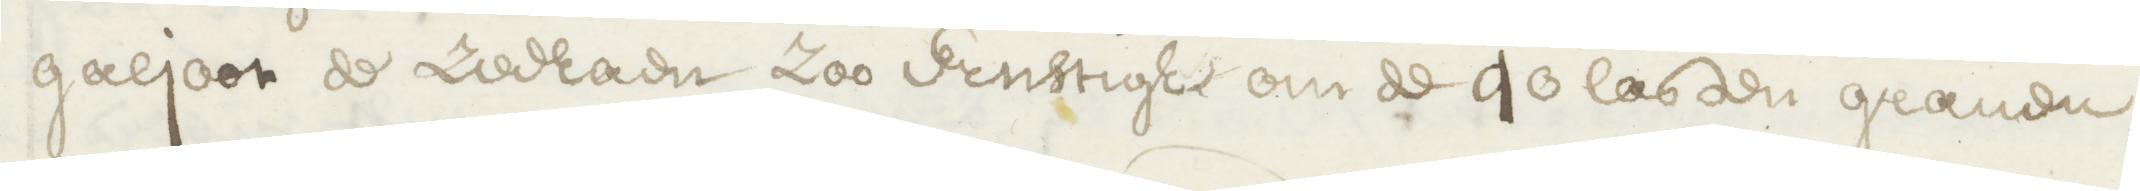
galjoot de zeehaen zoo Ernstighe om de 40 lasten granen
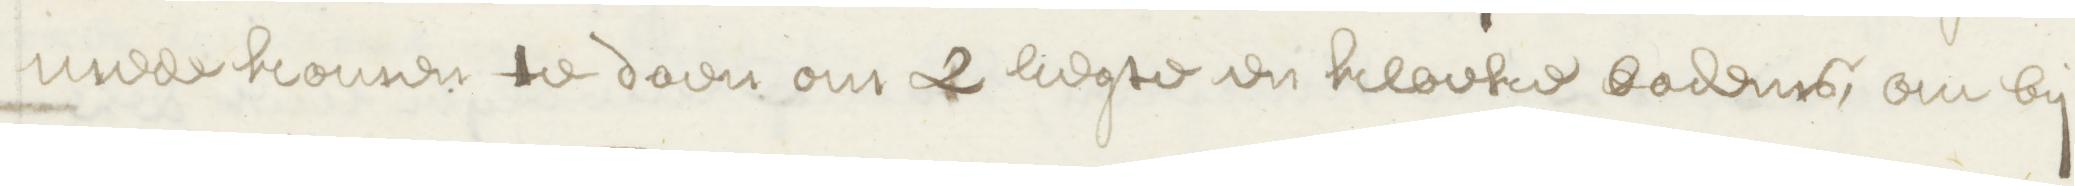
mede komen te doen om 2 liegte en kloeke bodems, om bij
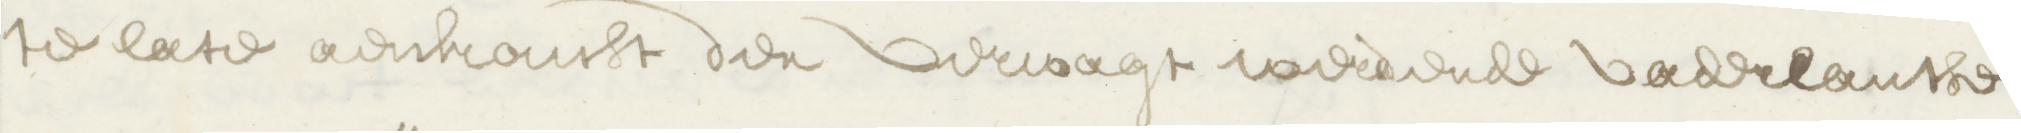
te late aenkomst der verwagt werdende vaderlantse
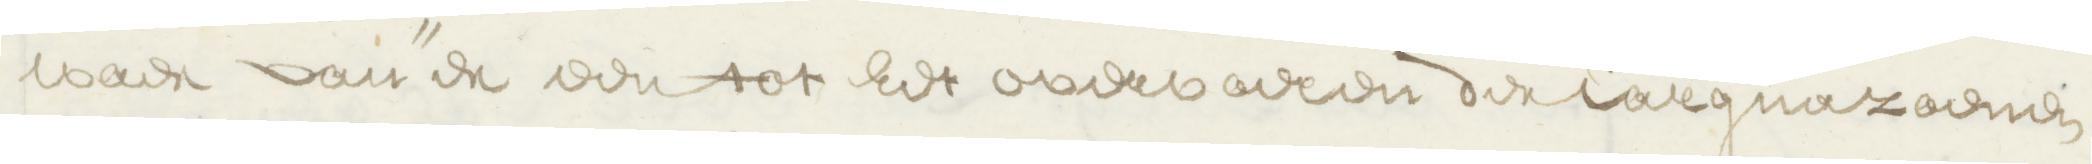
waer van ''er een tot het overvoeren der Carguazoenen
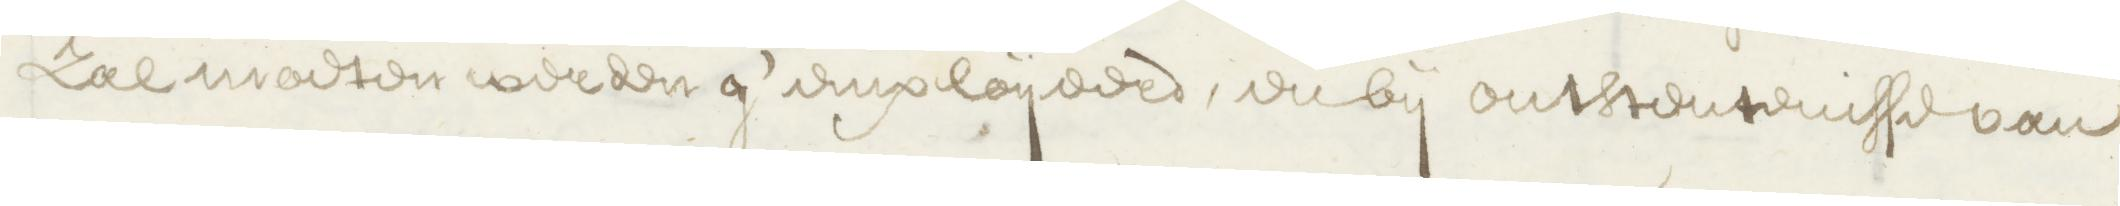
zal moeten werden g’emploijeerd, en bij ontstentenisse van
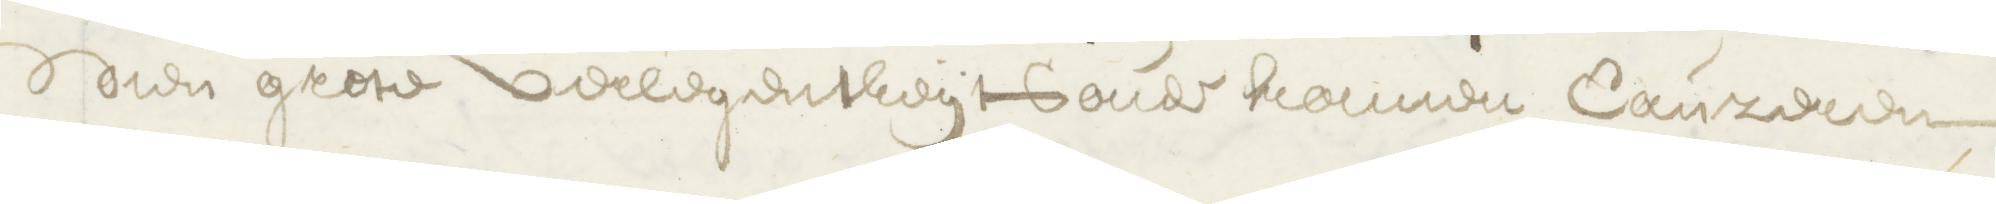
dien grote verlegentheijt soude konnen Cauzeren
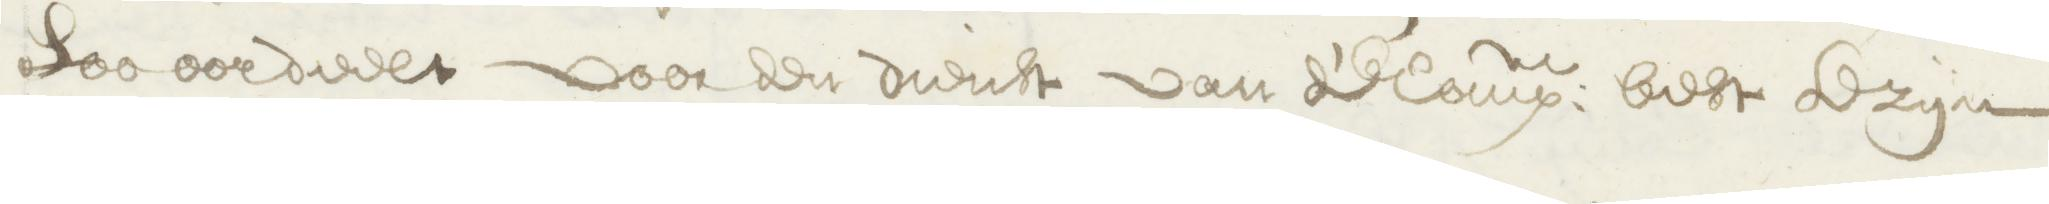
soo oordeelt voor den dienst van d'E Comp: best te zijn
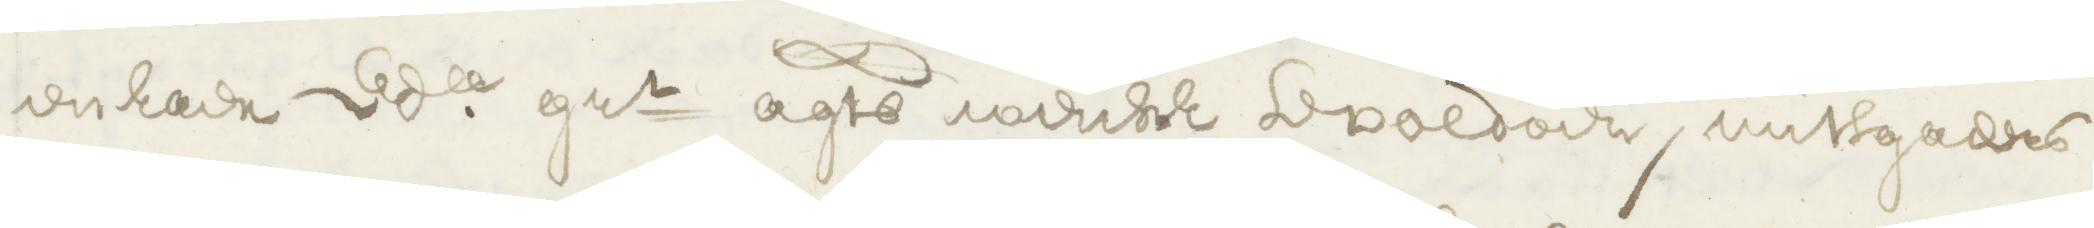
en haer Ed.le gr=t agtb wensch te voldoen, mitsgaders
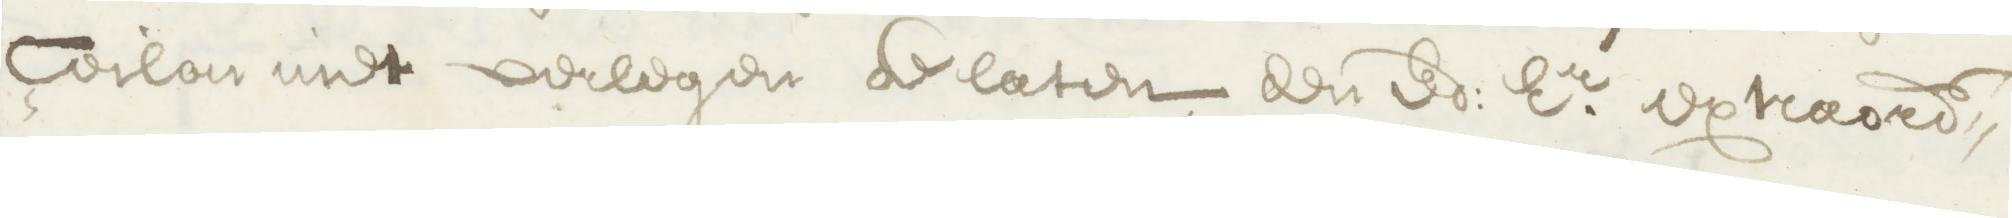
Ceilon niet verlegen te laten den Ed: h.re extraord„s
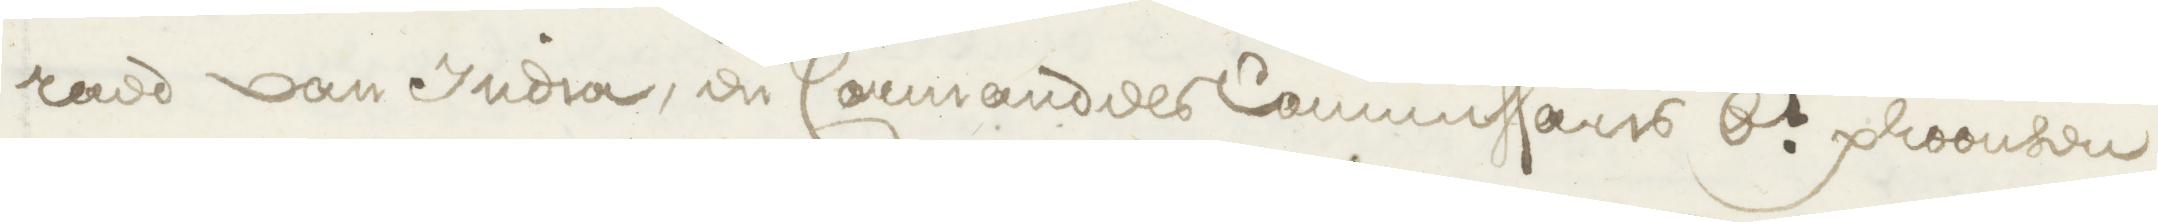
raed van India, en Cormandels Commissaris b.t phoonsen
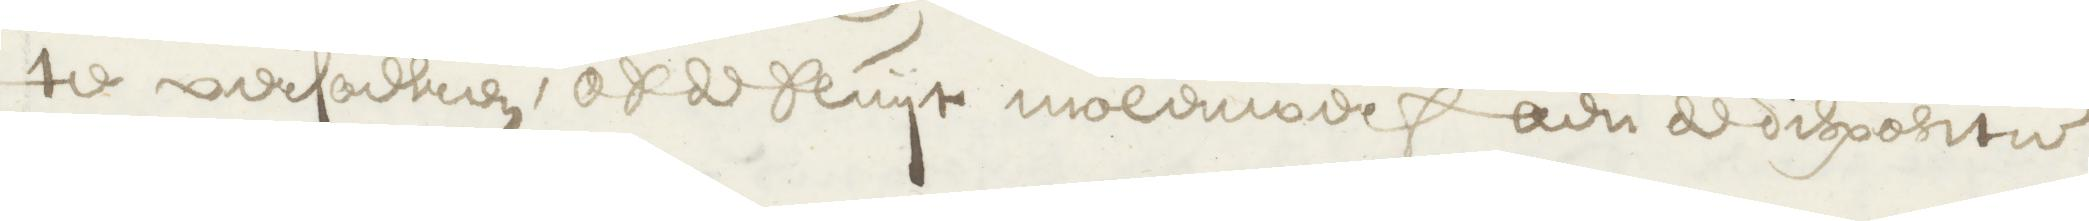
te versoeken, of de fluijt molenwerf aen de dispositie
